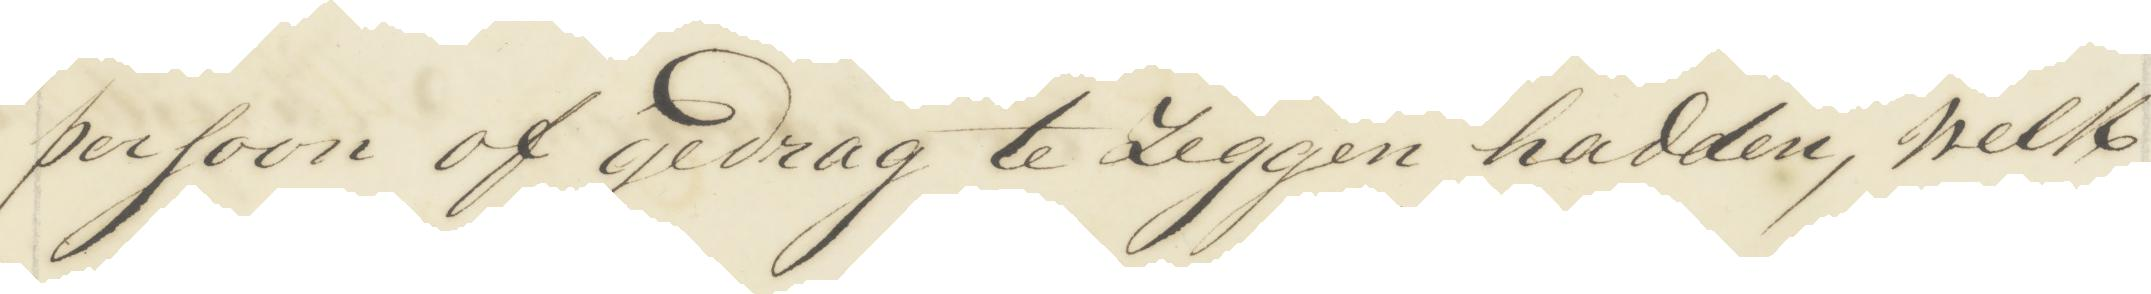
persoon of gedrag te zeggen hadden, welk
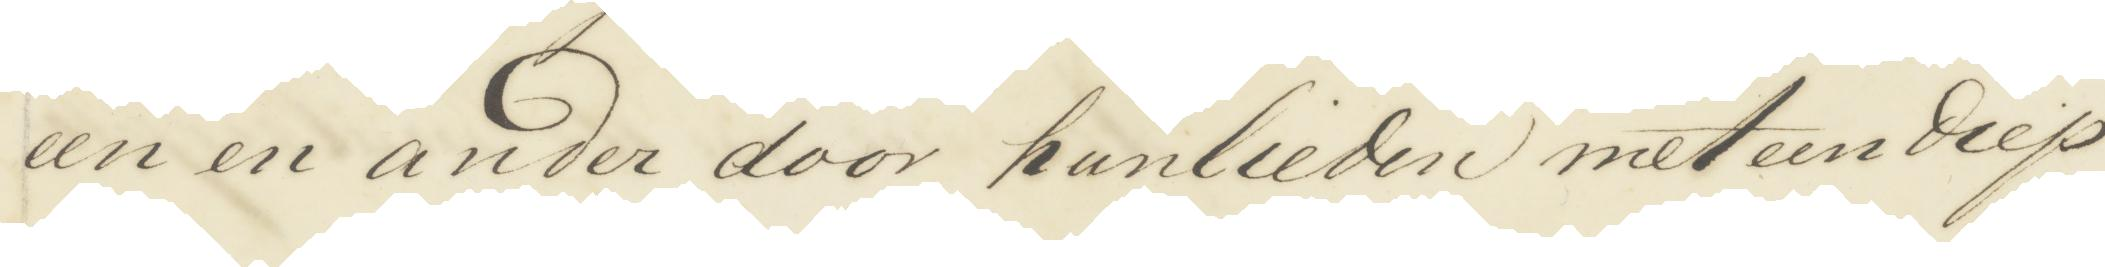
een en ander door hunlieden met een diep
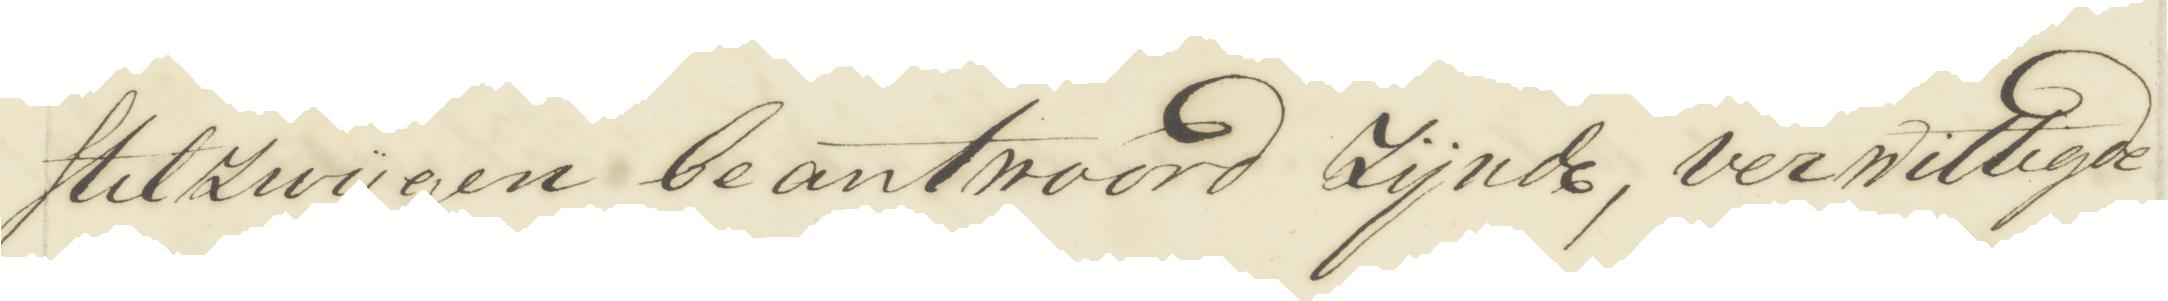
stilzwijgen beantwoord zijnde, verwittigde
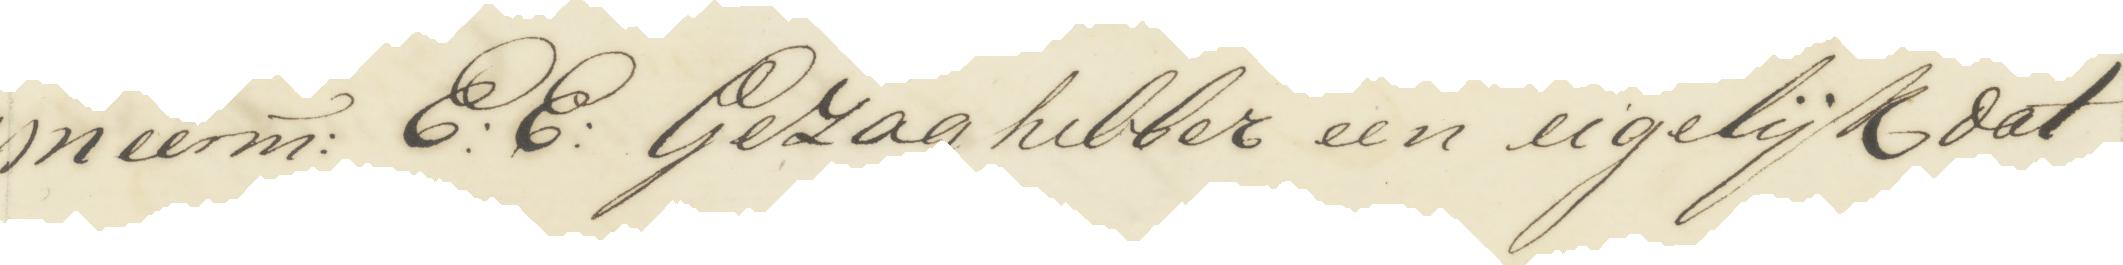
meerm: E:E: Gezaghebber een eigelijk dat
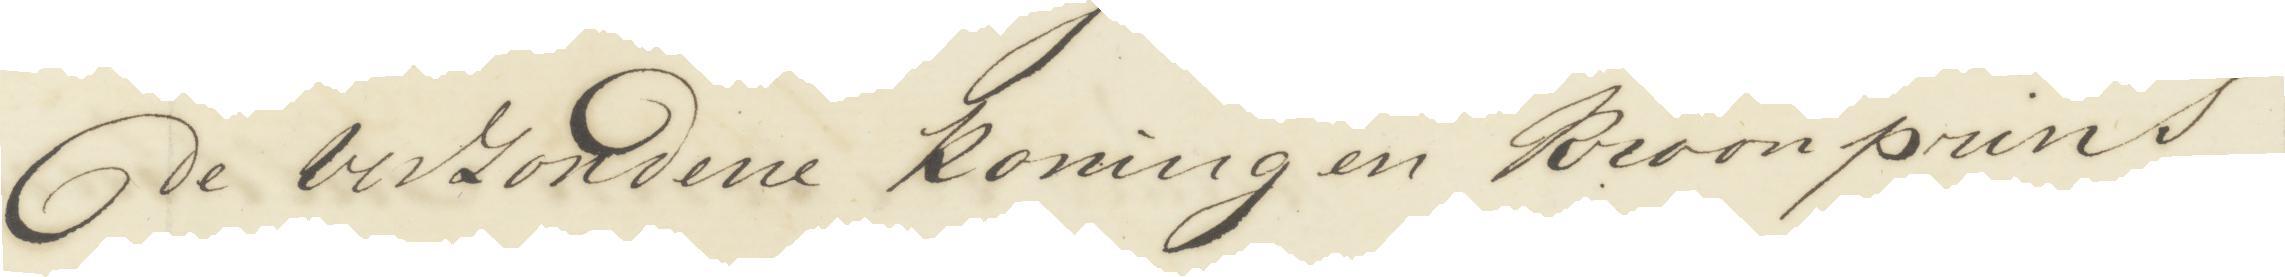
de verzondene koning en kroon prins
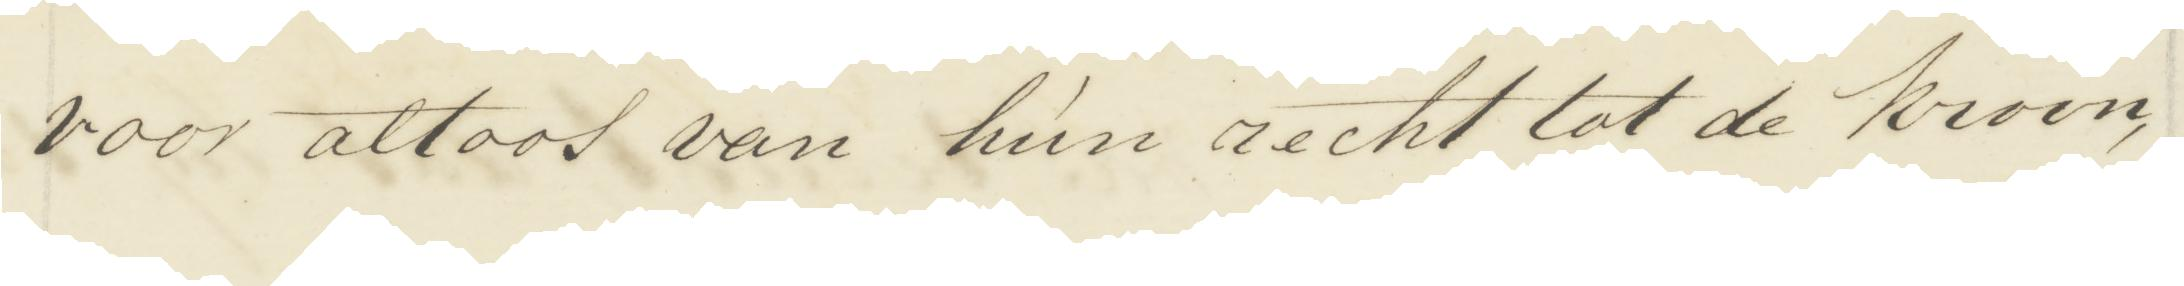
voor altoos van hun recht tot de kroon,
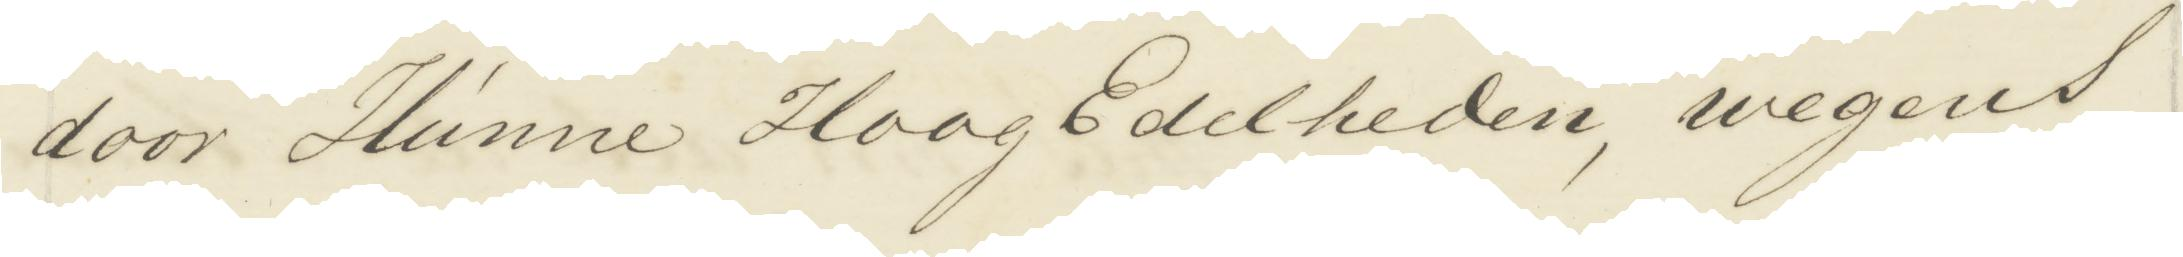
door Hunne Hoog Edelheden, wegens
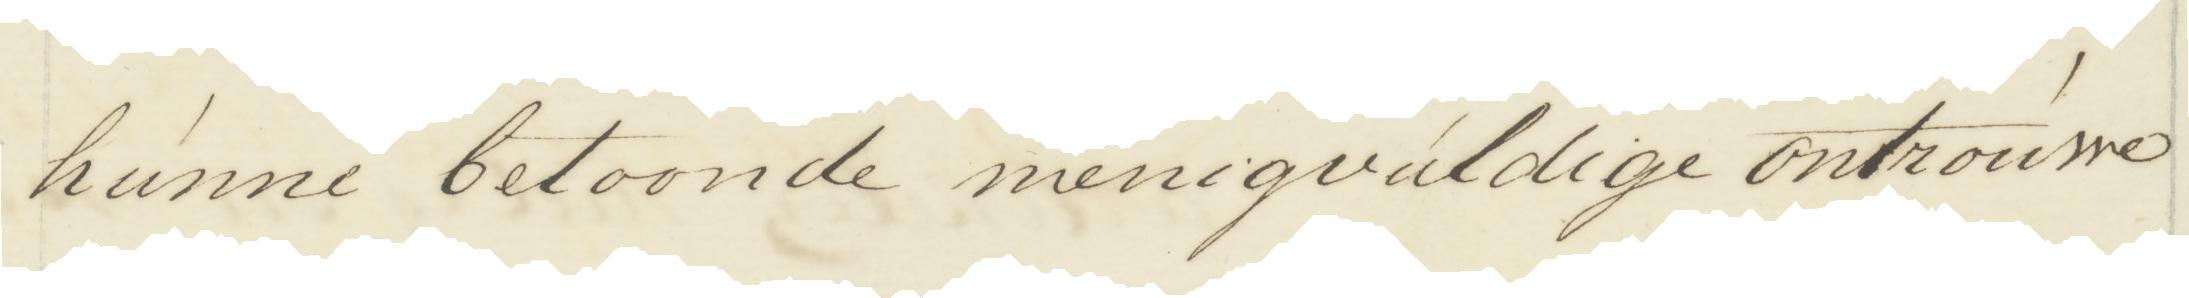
hunne betoonde menigvuldige ontrouwe
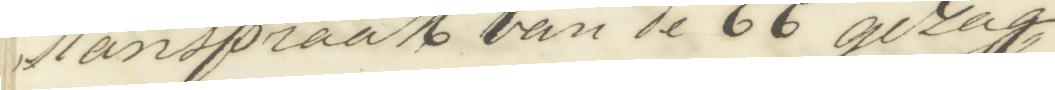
Aanspraak van de EE gezag„
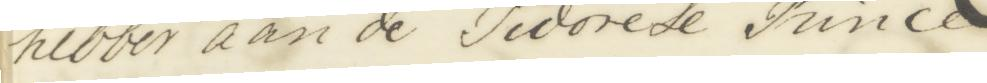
hebber aan de Tidorese Princen
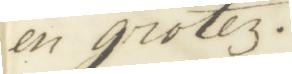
en groten.
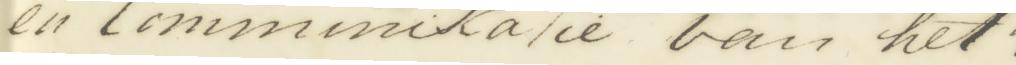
en Comminikatie van het
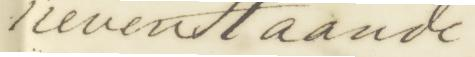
nevenstaande
